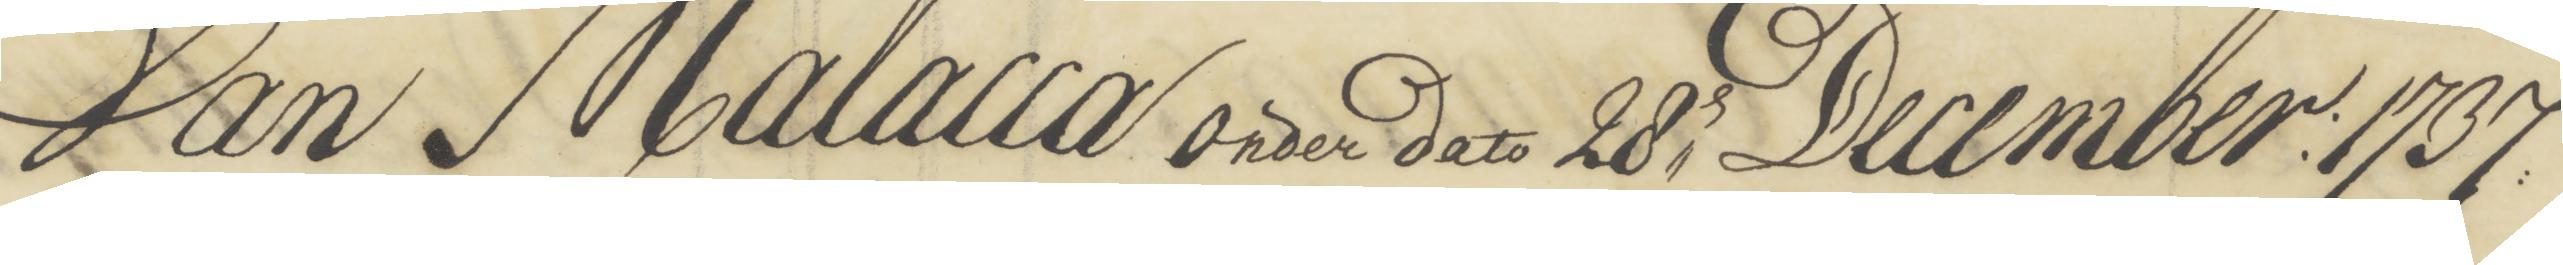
Van Malacca onder dato 28„en December: 1737:
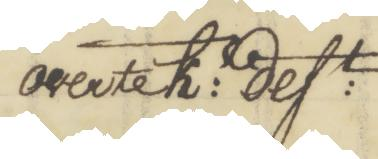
overtek: des:t
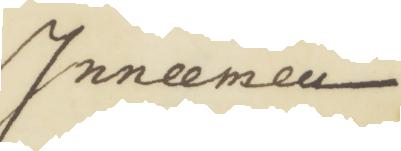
Inneemen
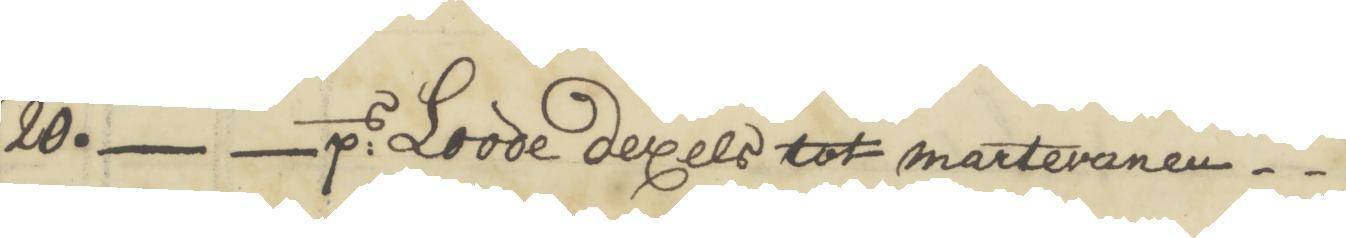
20. — — p:s Loode dexels tot martevanen - -
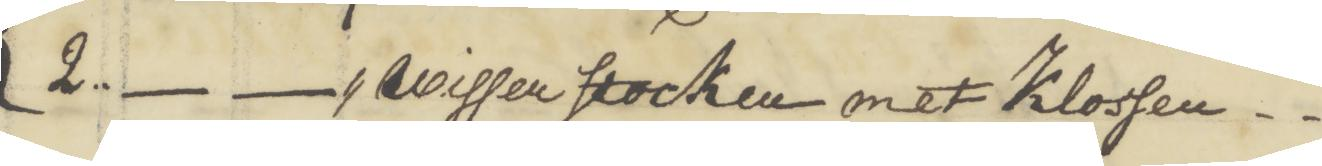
2.. — — „ wisser stocken met klossen - -
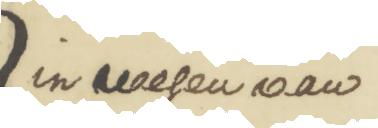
in wesen van
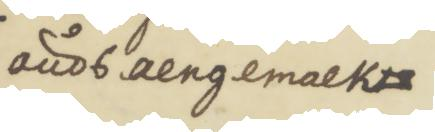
auds aengemaekt
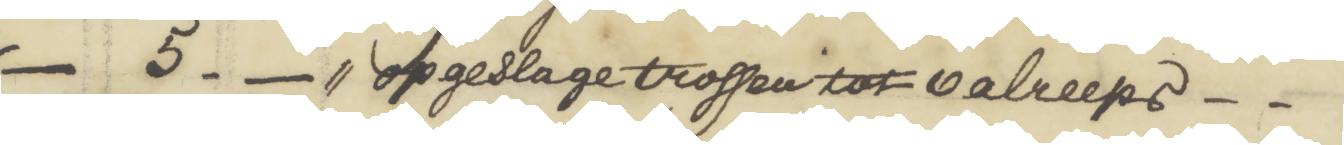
— 5. –„ opgeslage trossen tot valreeps - -
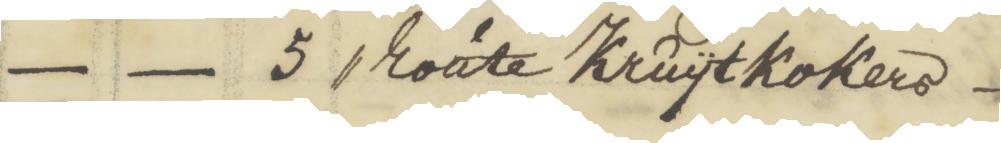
— — 5 „houte Kruijtkokers -
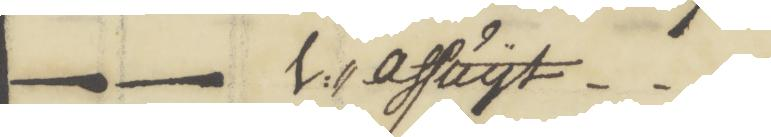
— — 1:„ affuijt - -
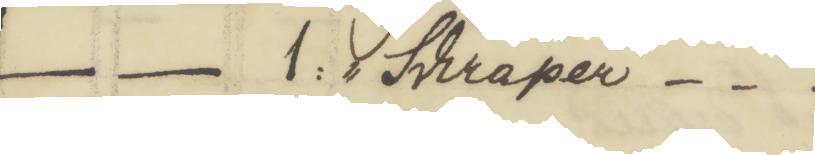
— — 1.„ schraper - -
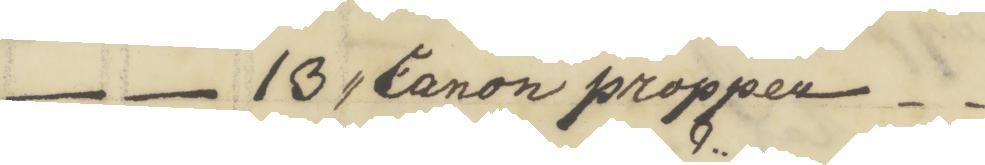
— — 13„ Canon proppen - -
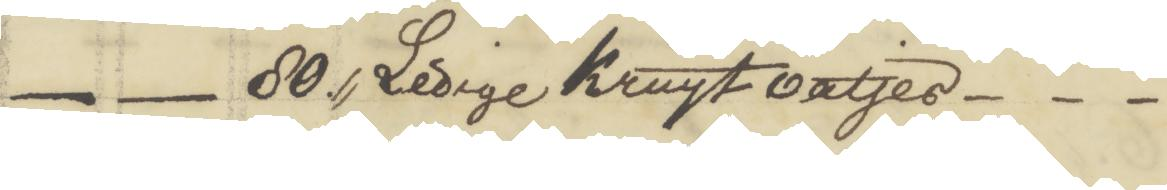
— — 80.„ Ledige kruijt vatjes - - -
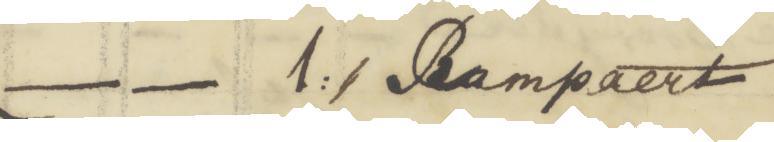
— — 1:„ Rampaert
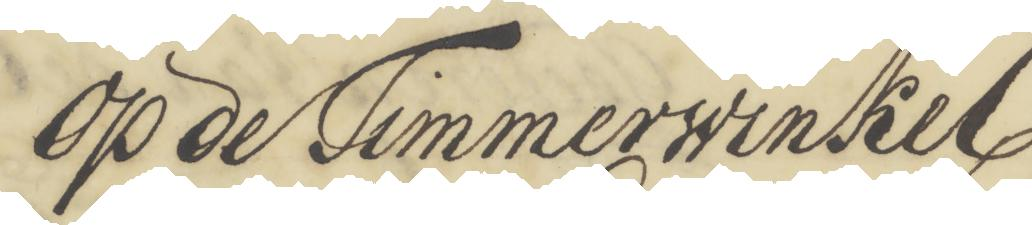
Op de Timmerwinkel
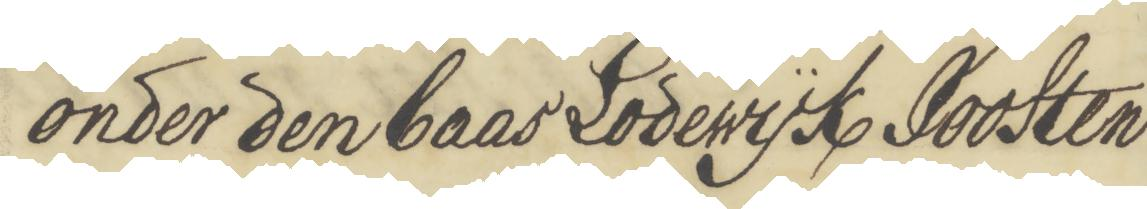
onder den baas Lodewijk Joosten
